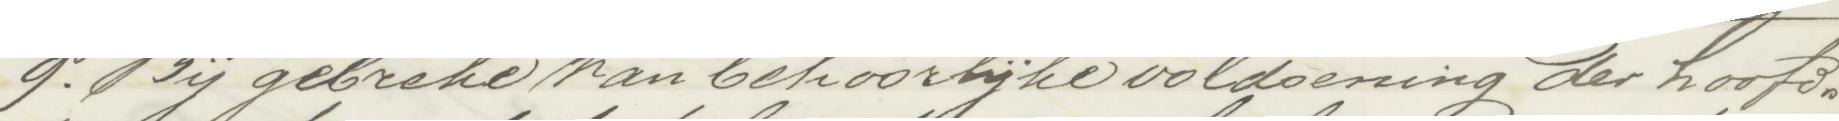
9. Bij gebreke van behoorlijke voldoening der hoofd
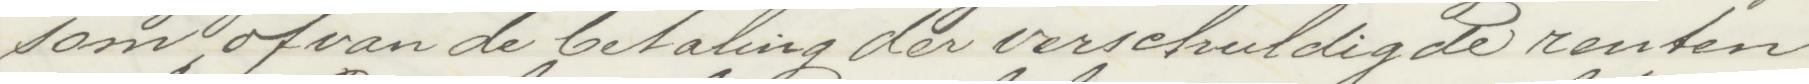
som of van de betaling der verschuldigde renten
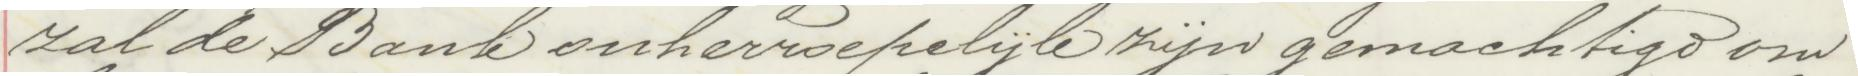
zal de Bank onherroepelijk zijn gemachtigd om
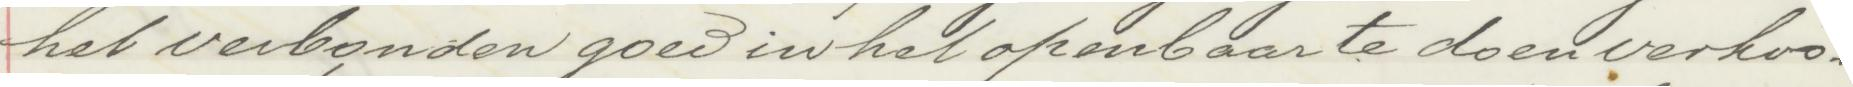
het verbonden goed in het openbaar te doen verkoo„
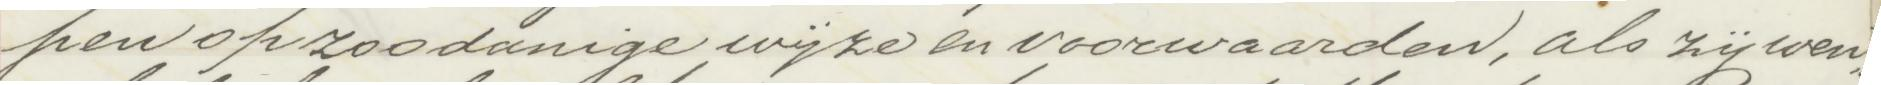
pen op zoodanige wijze en voorwaarden, als zij wen„
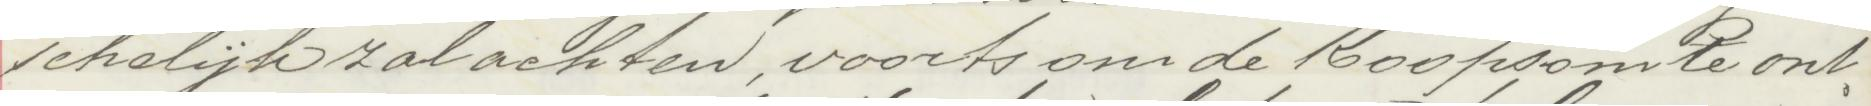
schelijk zal achten, voorts om de koopsom te ont„
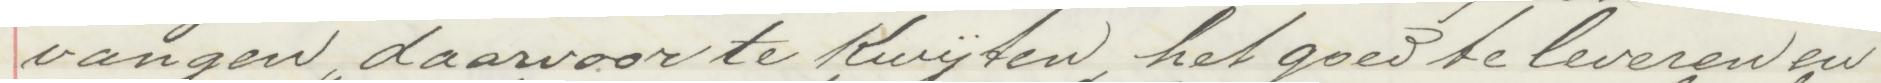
vangen, daarvoor te kwijten, het goed te leveren en
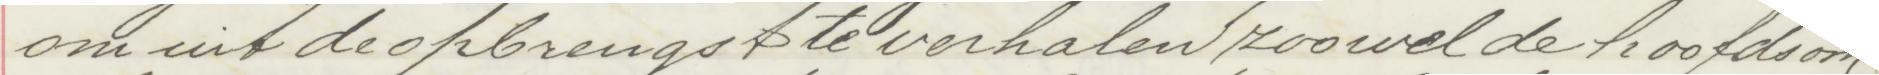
om uit de opbrengst te verhalen zoowel de hoofdsom
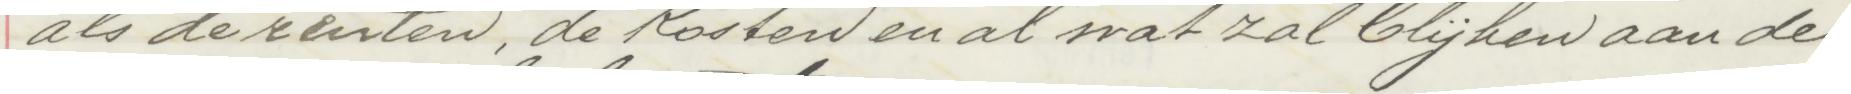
als de renten, de kosten en al wat zal blijken aan de
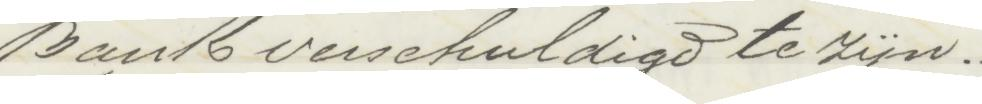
Bank verschuldigd te zijn.
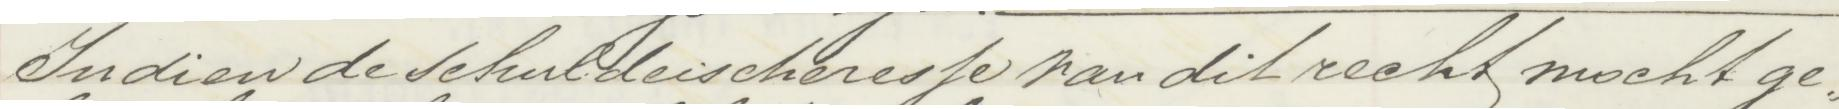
Indien de schuldeischeresse van dit recht mocht ge„
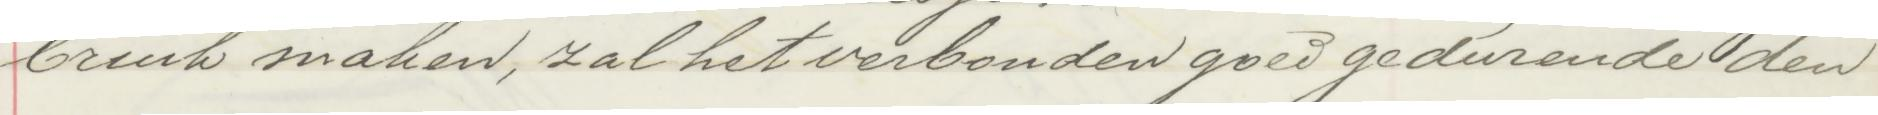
bruik maken, zal het verbonden goed gedurende den
